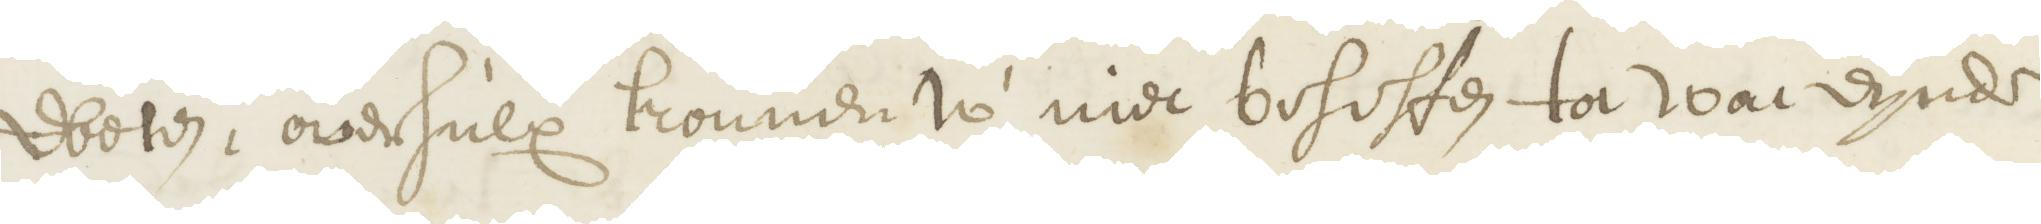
weten, oversulx konnen w' niet besesfen tot wat eijnde
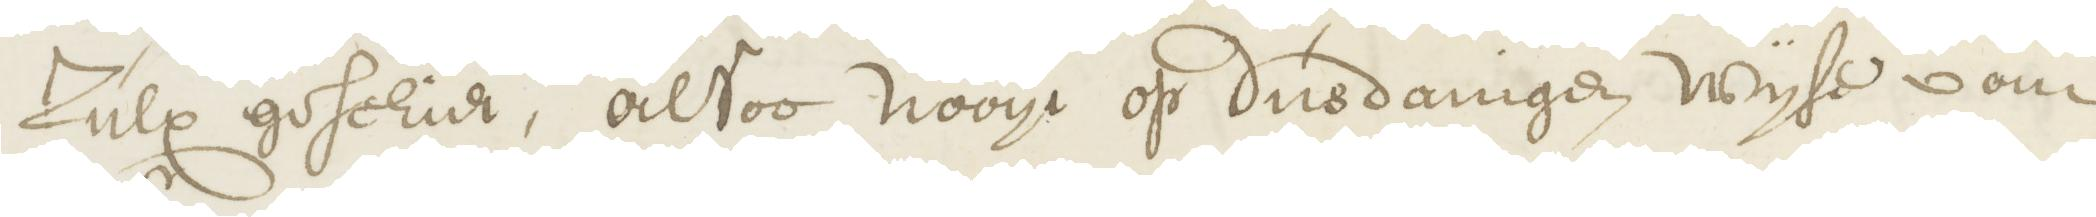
zulx geschiet, alsoo nooijt op dusdanigen wijse van
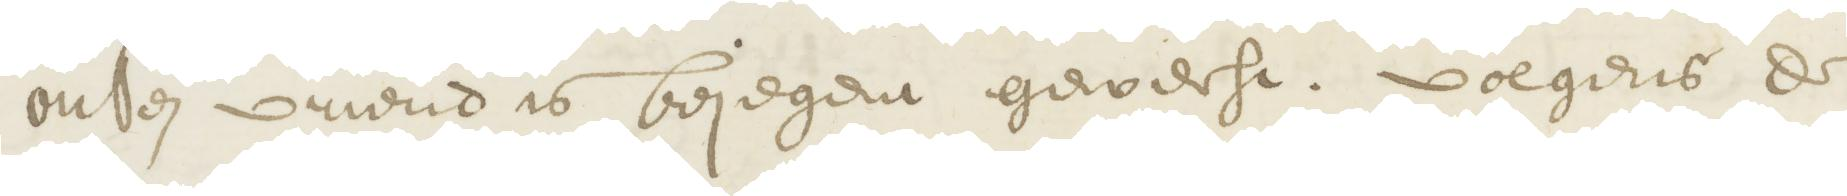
onsen vriend is bejegent geweest. volgens de
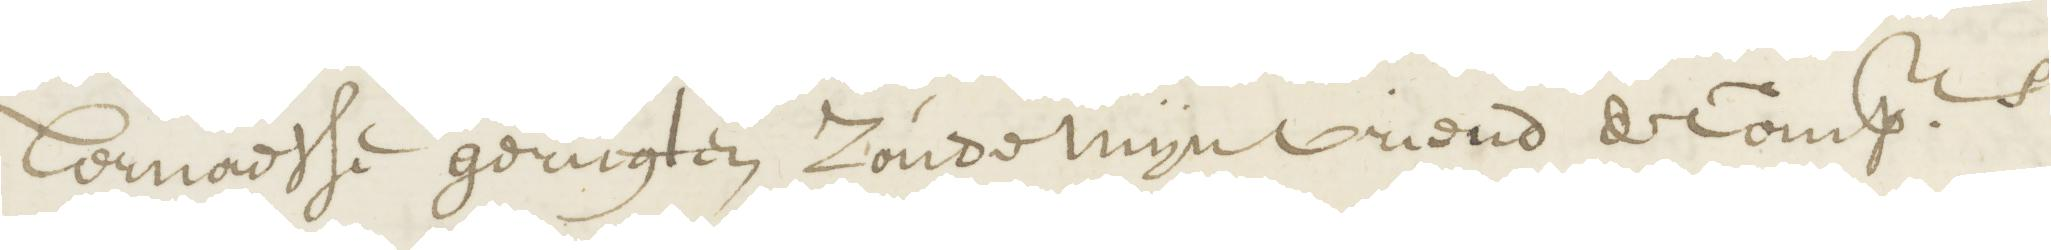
Ternaetse gerugten zoude mijn vriend de Comp:s
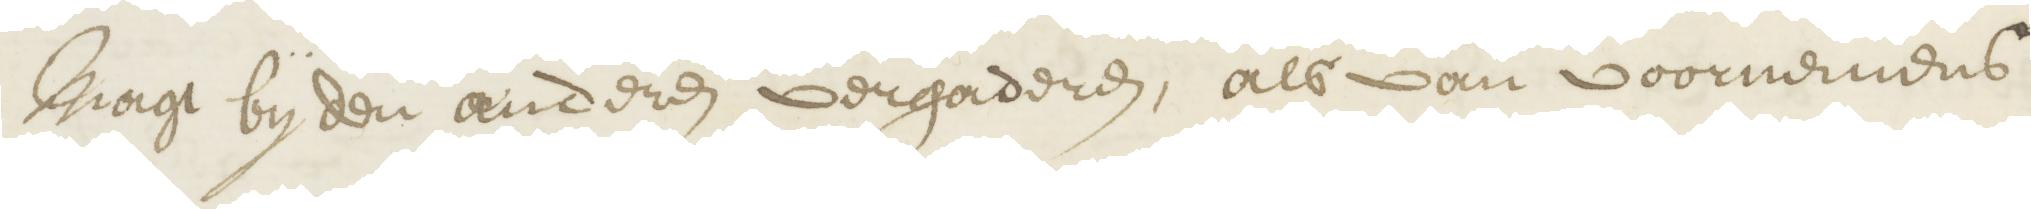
magt bij den anderen vergaderen, als van voornemens
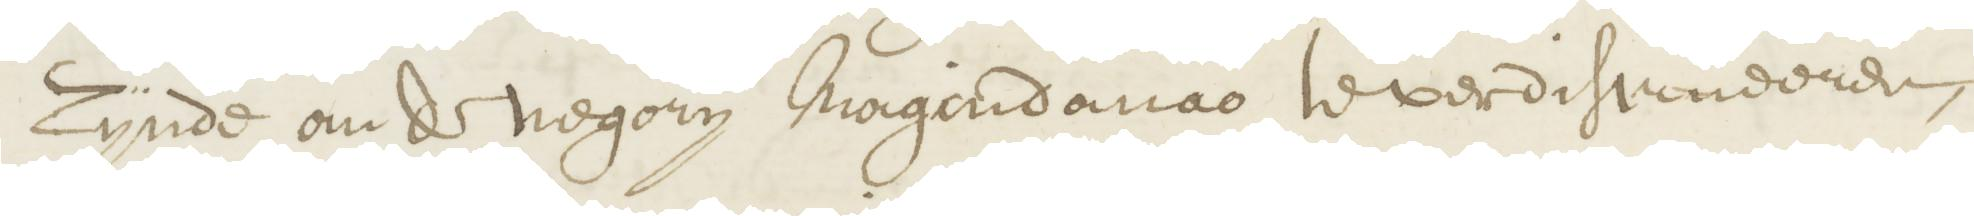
zijnde om de negorij magindanao te verdistrueeren,
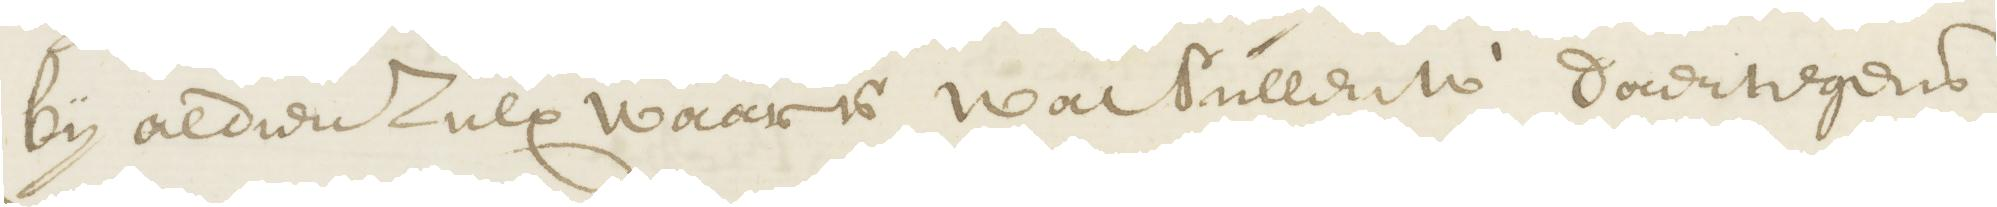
bij aldien zulx waar is wat sullen w' daertegens
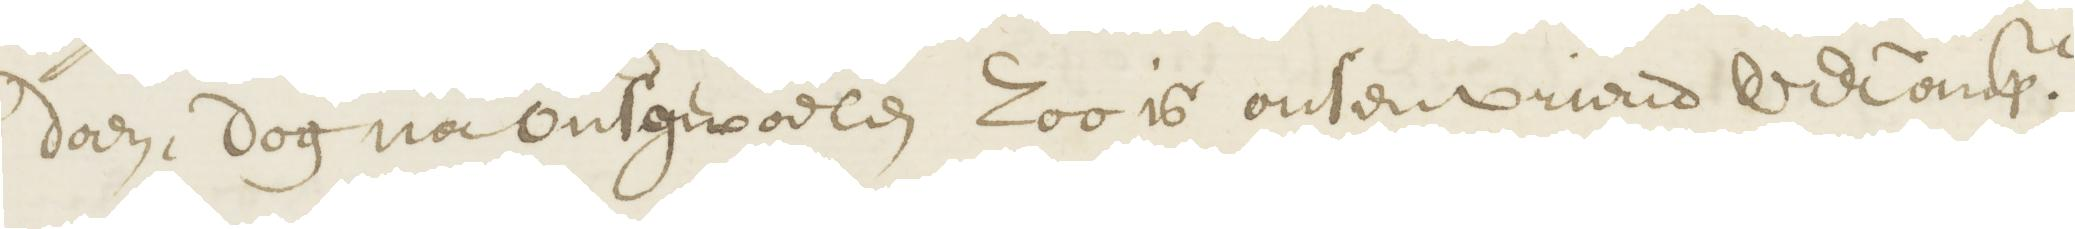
doen, dog na ons gevoelen zoo is onsen vriend de EComp:e
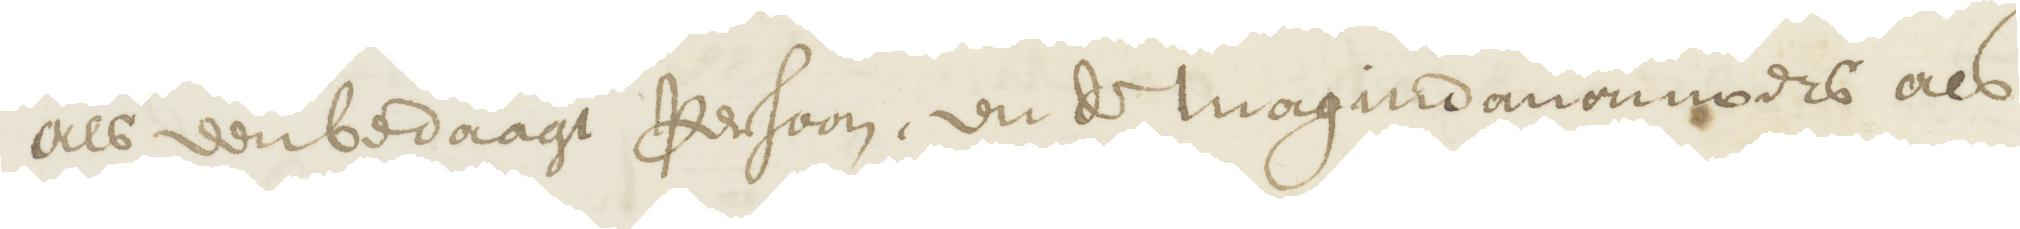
als een bedaagt persoon, en de magindanauwers als
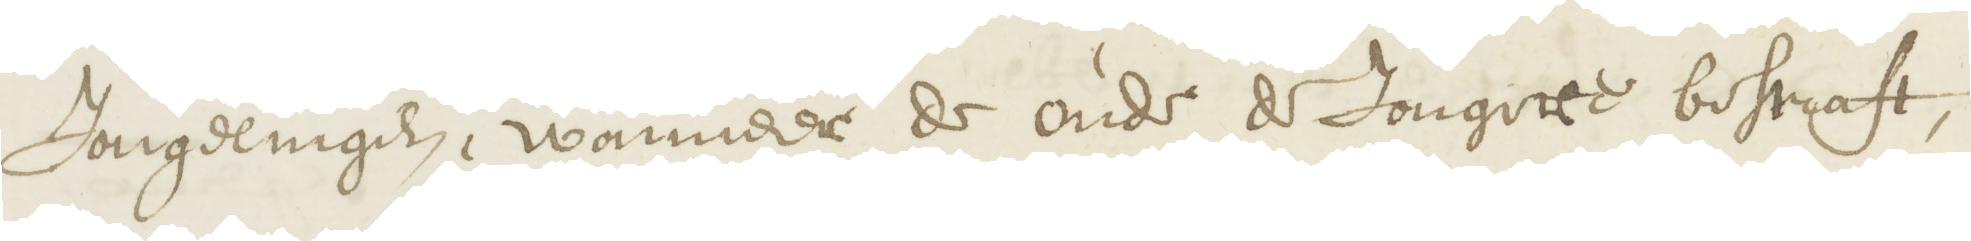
Iongelingen, wanneer de oude de Iongere bestraft,
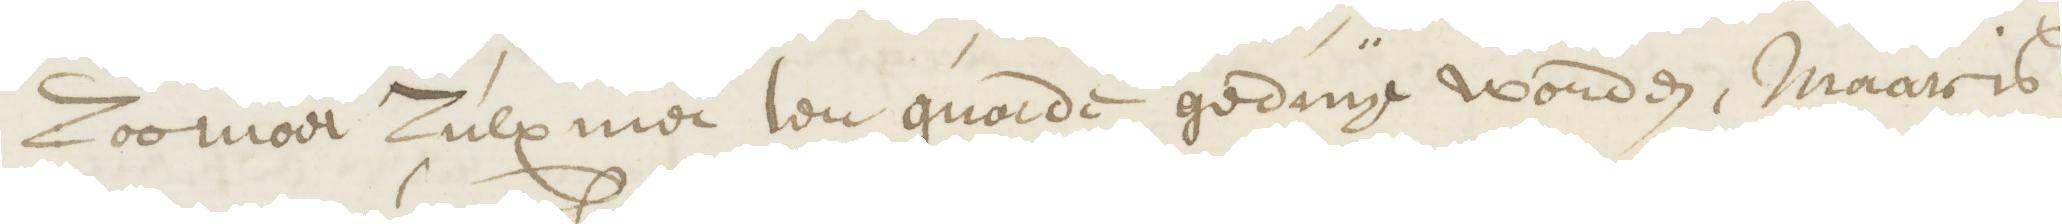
zoo moet zulx niet ten quade geduijt worden, maar is
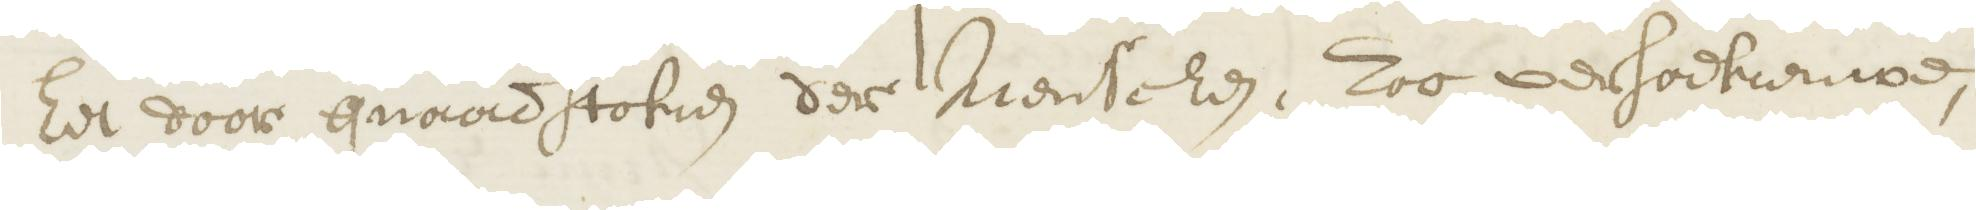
het door quaad stoken der menschen, zoo versoekenwe,
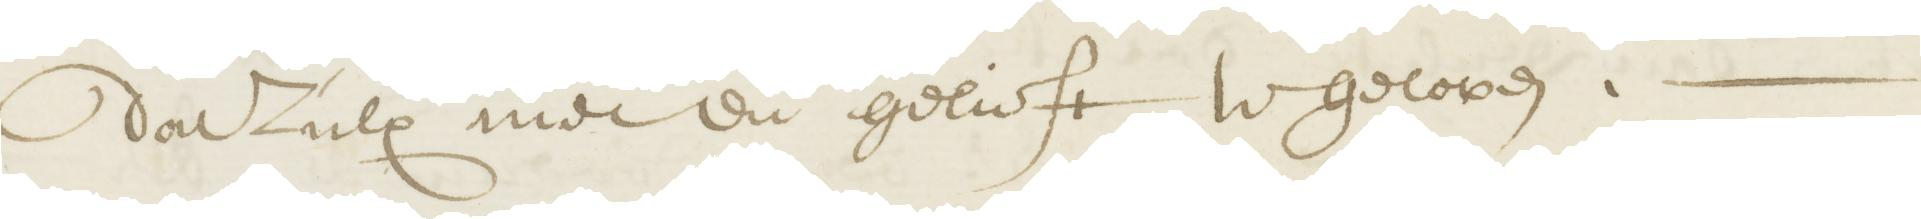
dat zulx niet en gelieft te geloven. —
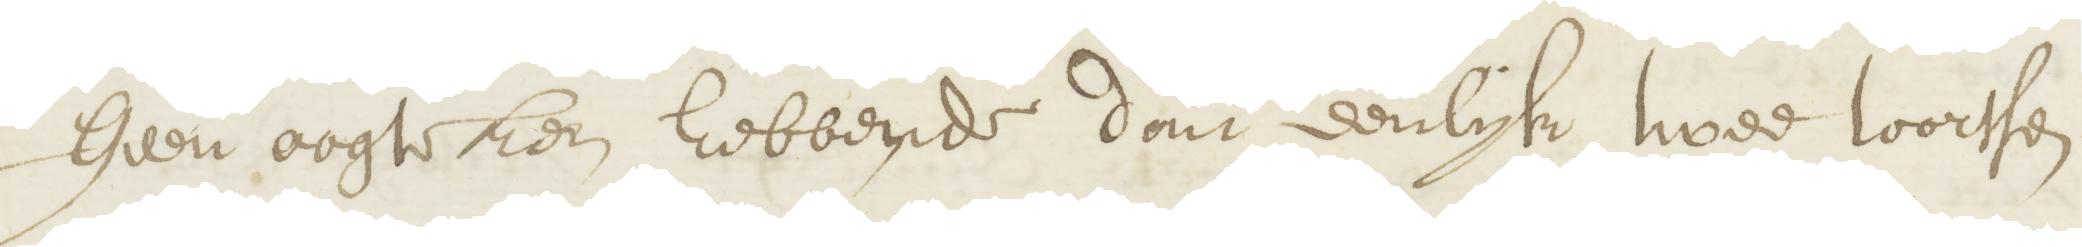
Geen oogteken hebbende dan eenlijk twee toortsen
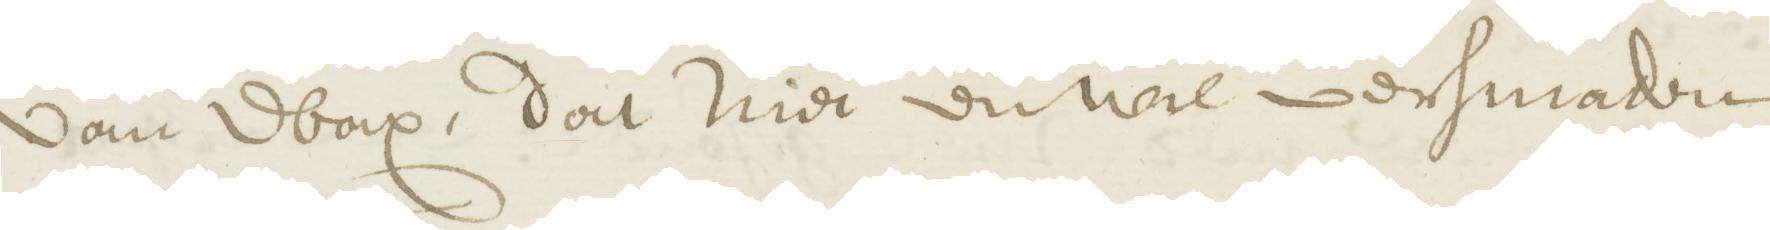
van wax, dat niet en wil versmaden
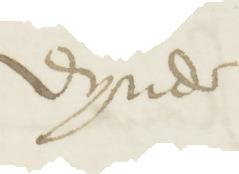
eijnde
